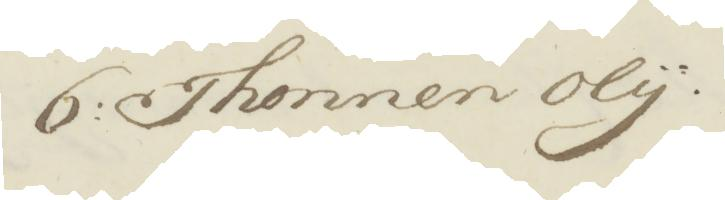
6. Thonnen olij.
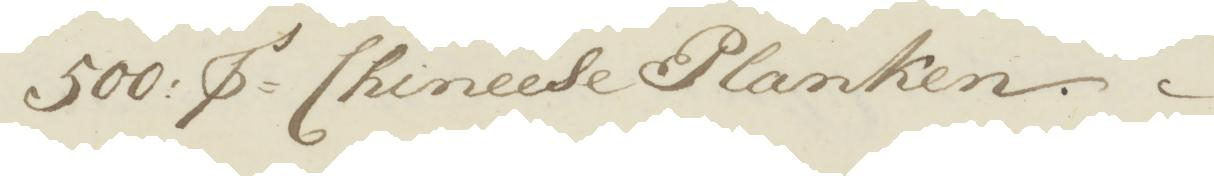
500: p=s chineese Planken.
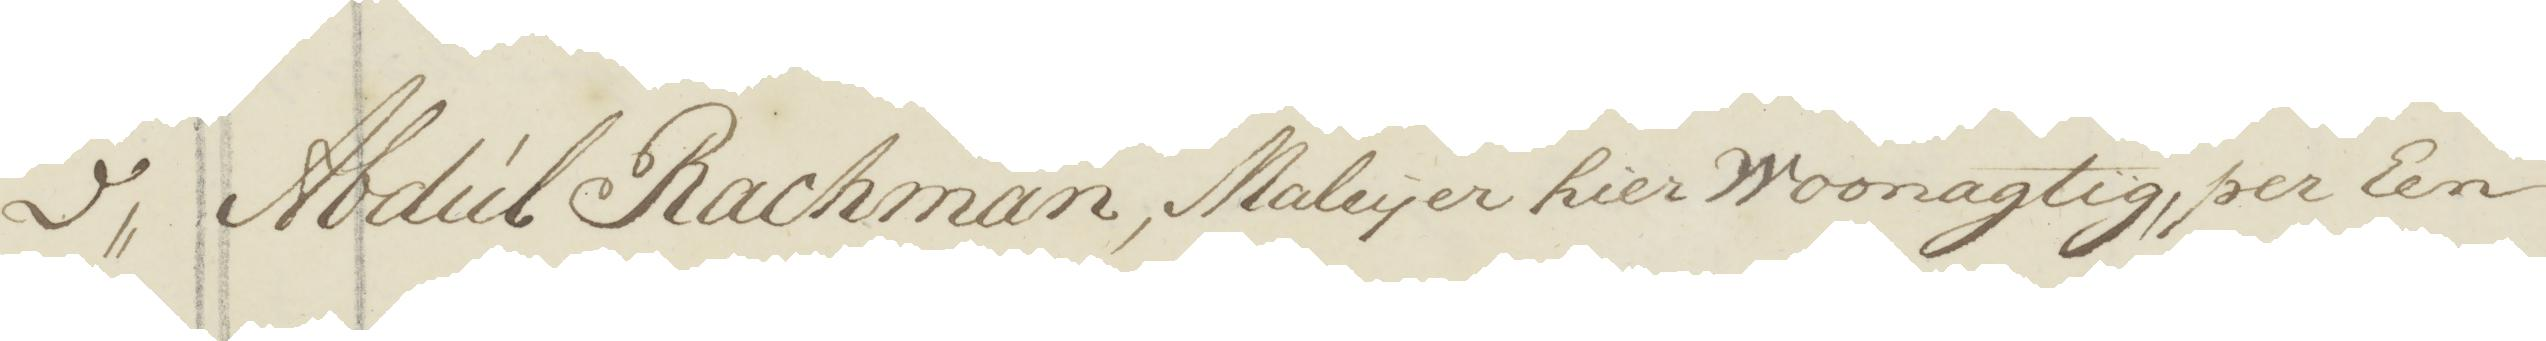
d„o Addul Rachman, Maleijer hier woonagtig, per Een
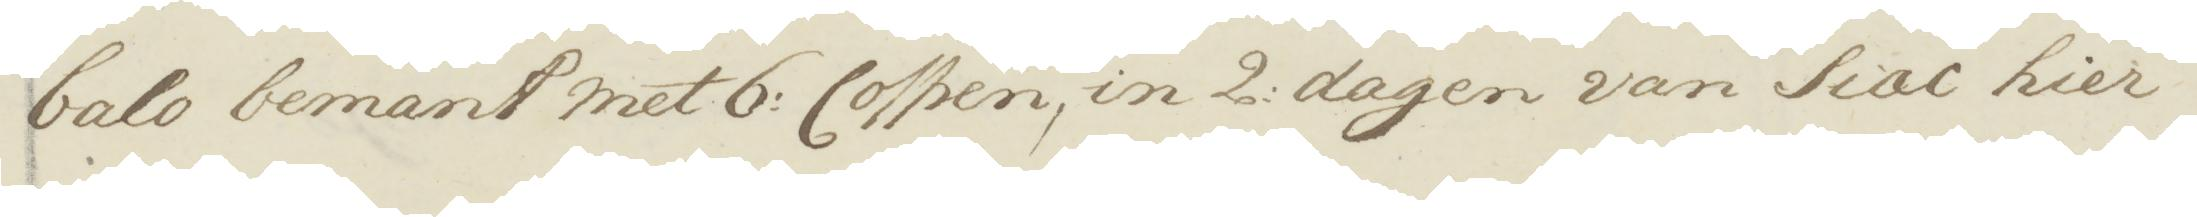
balo bemant met 6: coppen, in 2: dagen van Siac hier
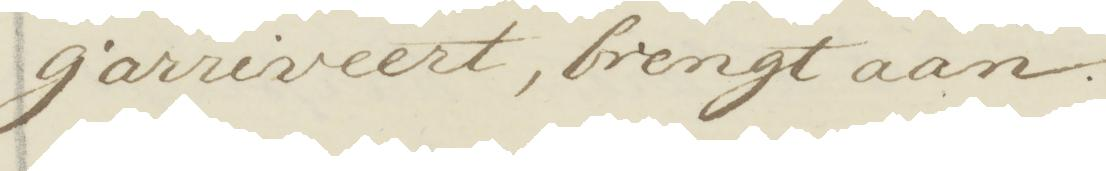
g'arriveert, brengt aan.
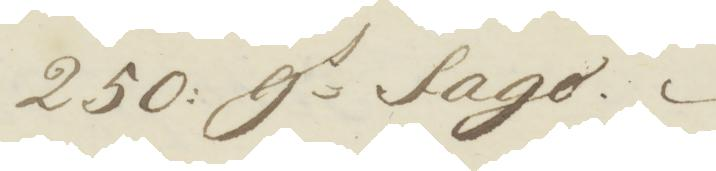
250: g=s Sagd:
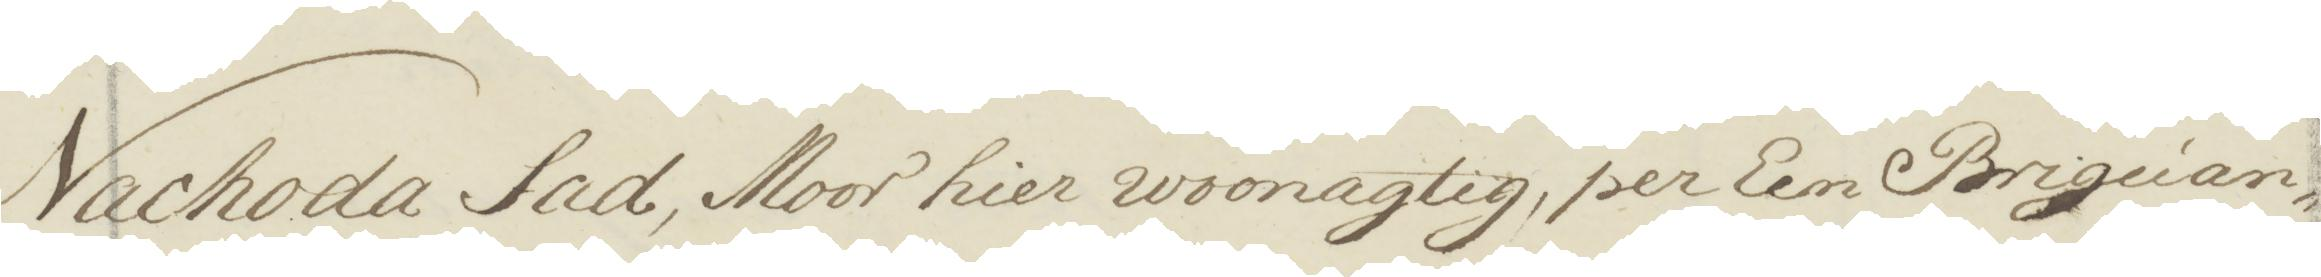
Nachoda Sad, Moor hier woonagtig, per Een Briguan„
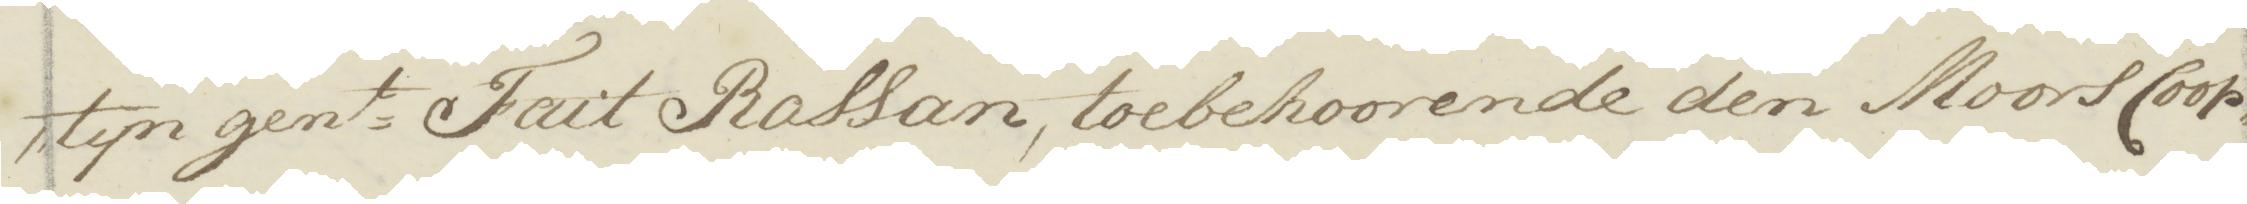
„tijn gen=t Fait Rassan, toebehoorende den Moors coop„
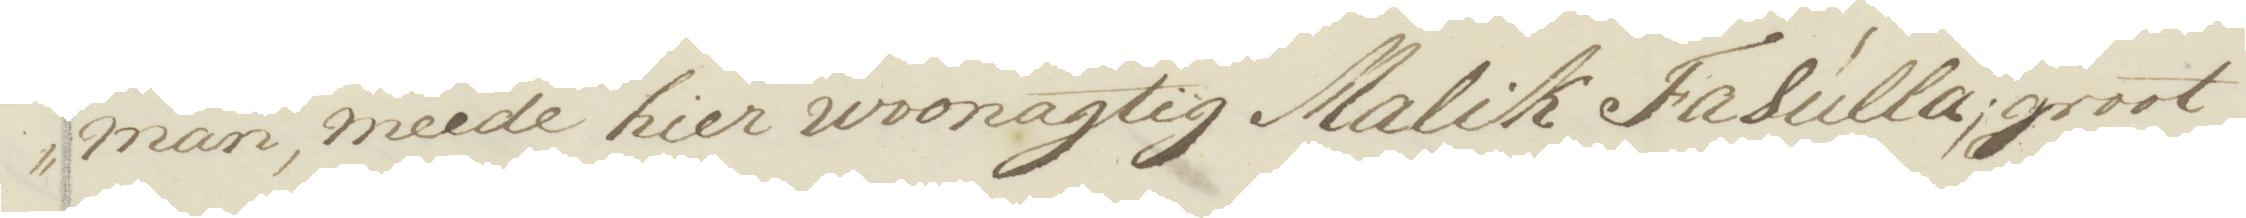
„man, meede hier woonagtig Malik Fasulla; groot
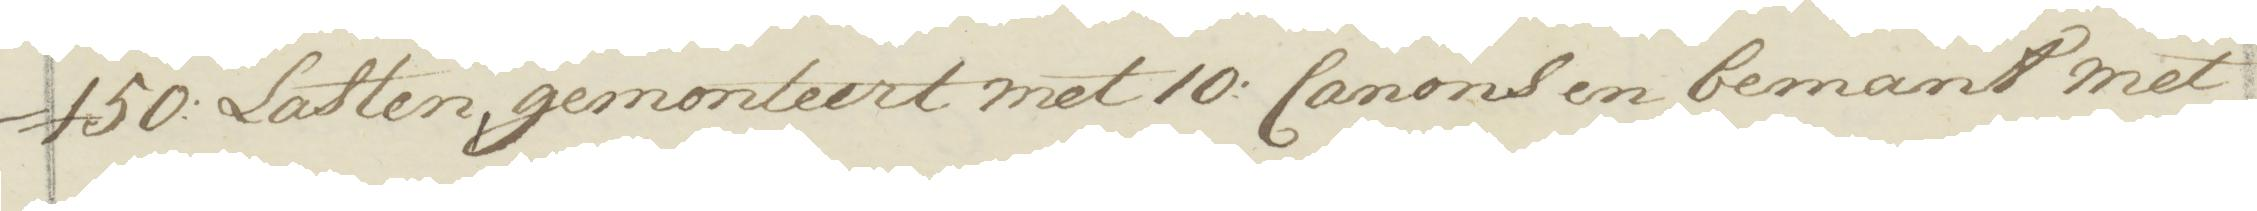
-150: Lasten, gemonteert met 10: canons en bemant met
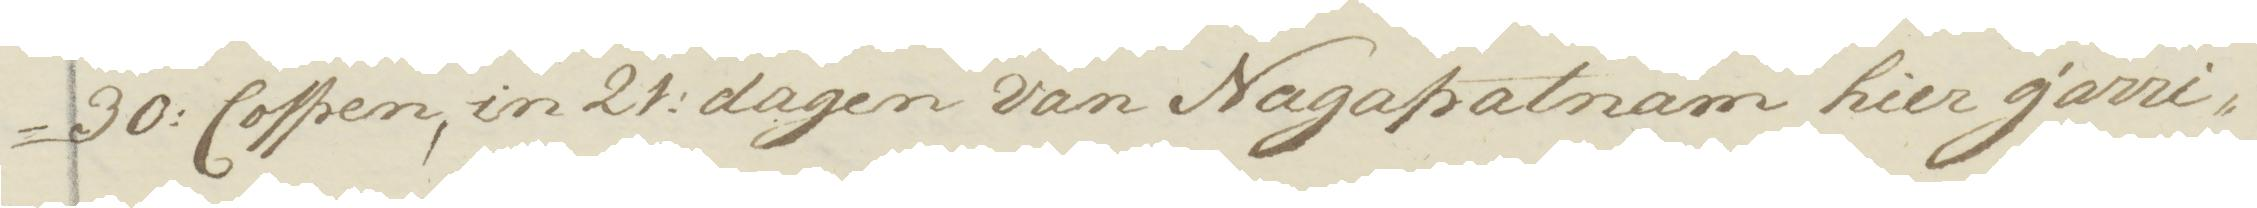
-30: coppen, in 21: dagen van Nagapatnam hier g'arri„
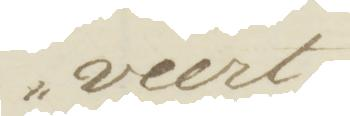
„veert
